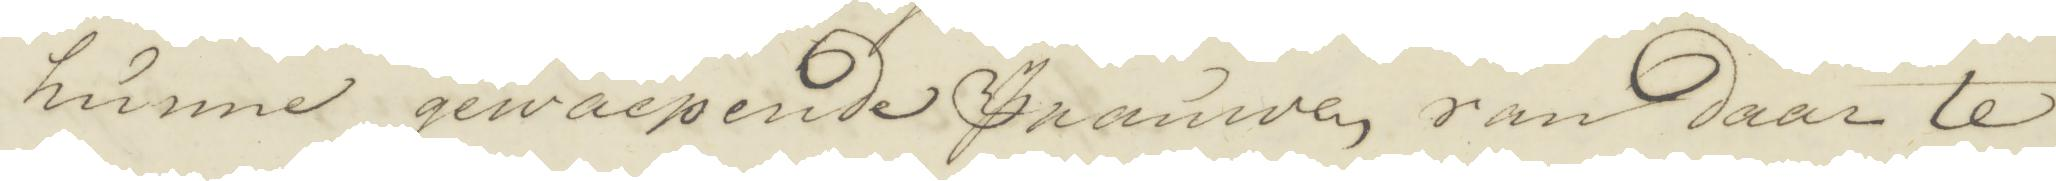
hunne gewaepende prauwen van daar te
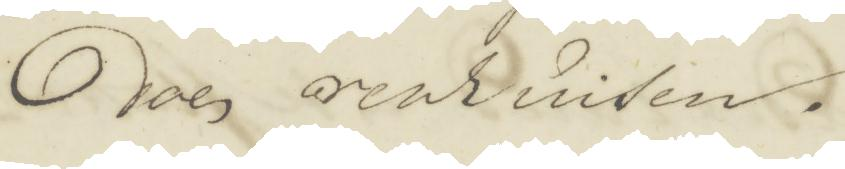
doen verhuisen.
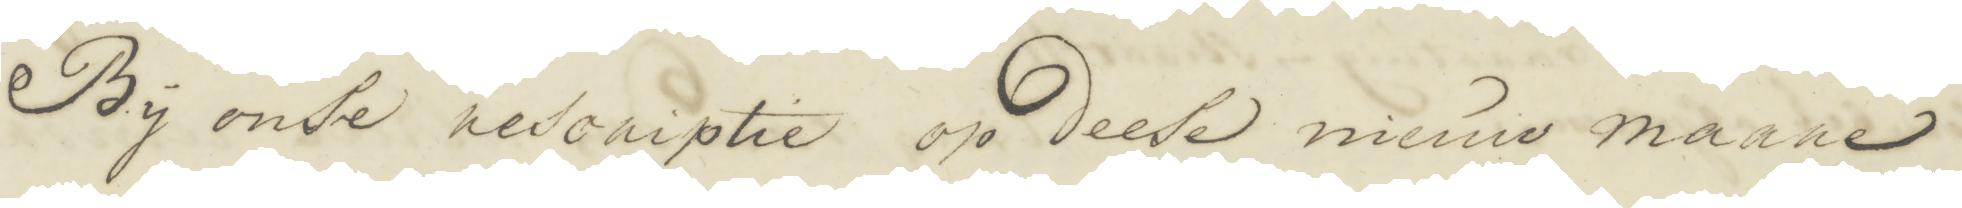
Bij onse rescriptie op deese nieuw maane
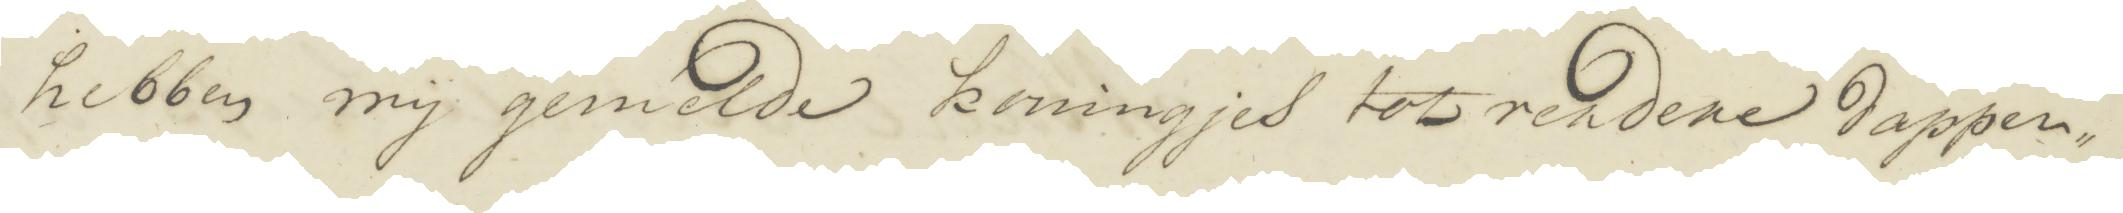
hebben wij gemelde koningjes tot verdere dapper„
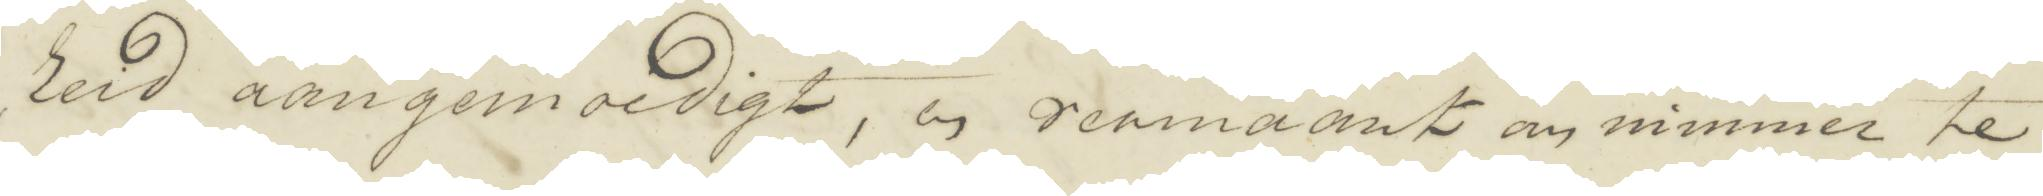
heid aangemoedigt, en vermaant om nimmer te
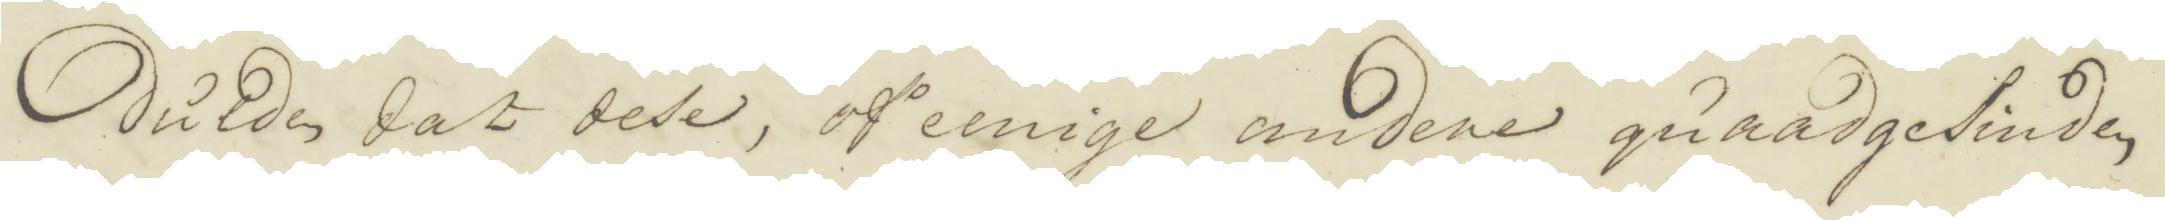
dulden dat dese, of eenige andere quaadgesinden
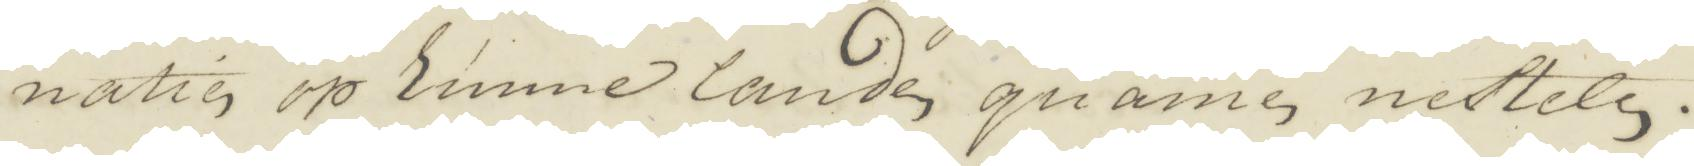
natien op hunne landen quamen nestelen
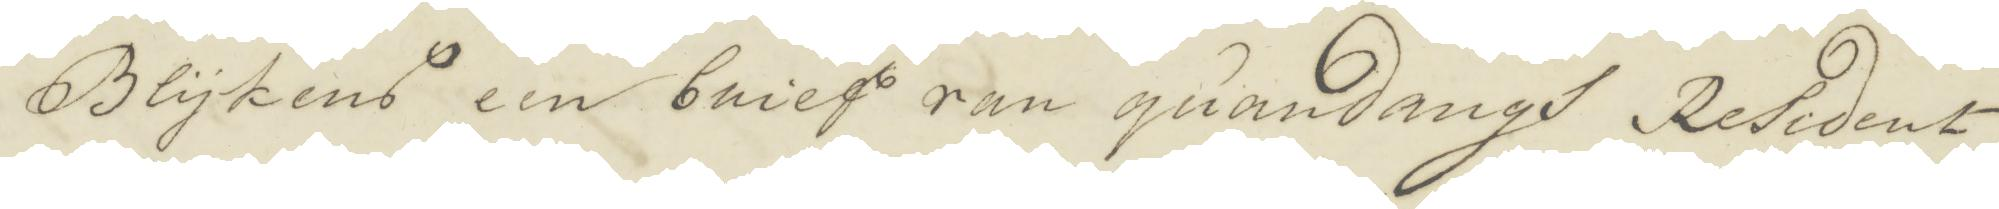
Blijkens een brief van quandangs Resident
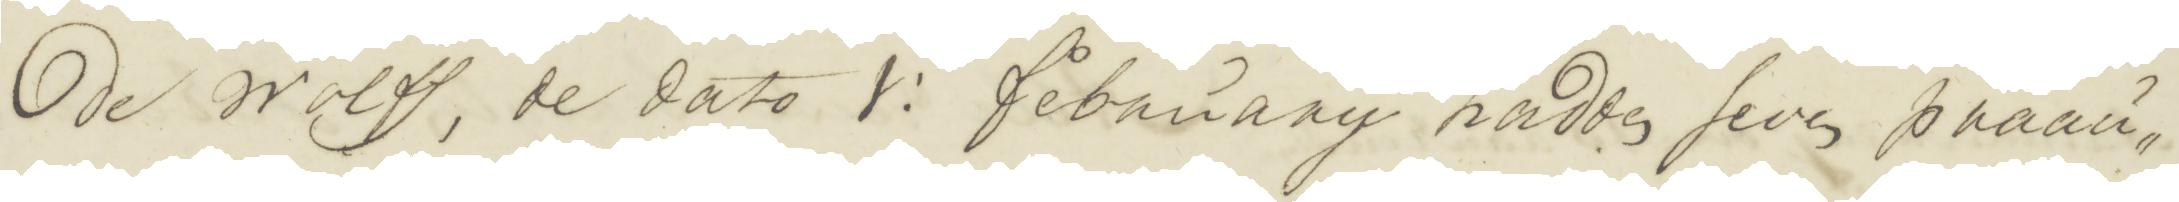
de wolff, de dato 1:e februarij hadden seven praau„
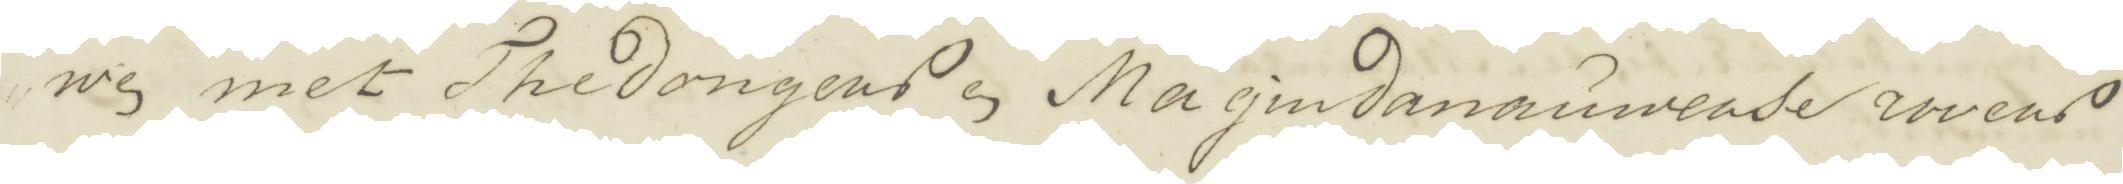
„wen met Thedongers en Magindanauwerse rovers
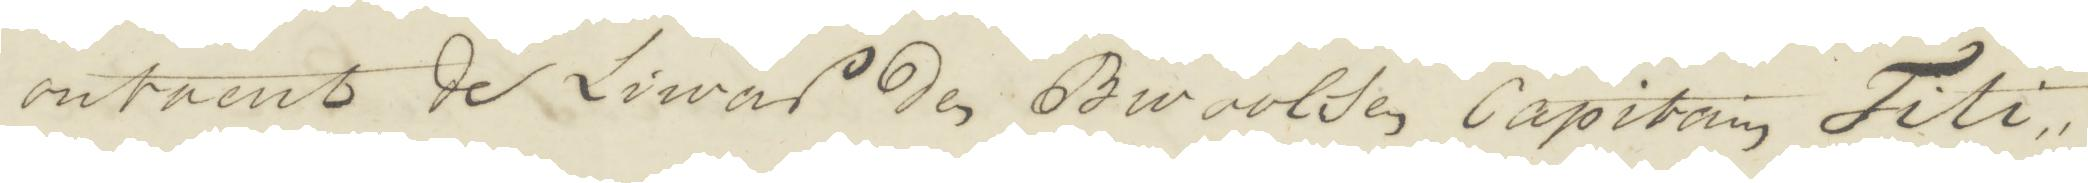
ontrent de Liwas den Bwoolsen capitain Titi„
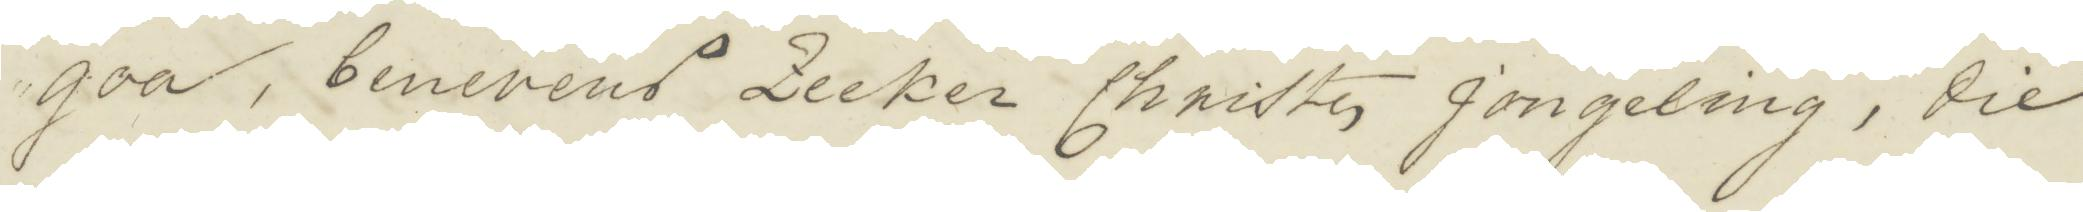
„goa, benevens zeeker Christen jongeling, die
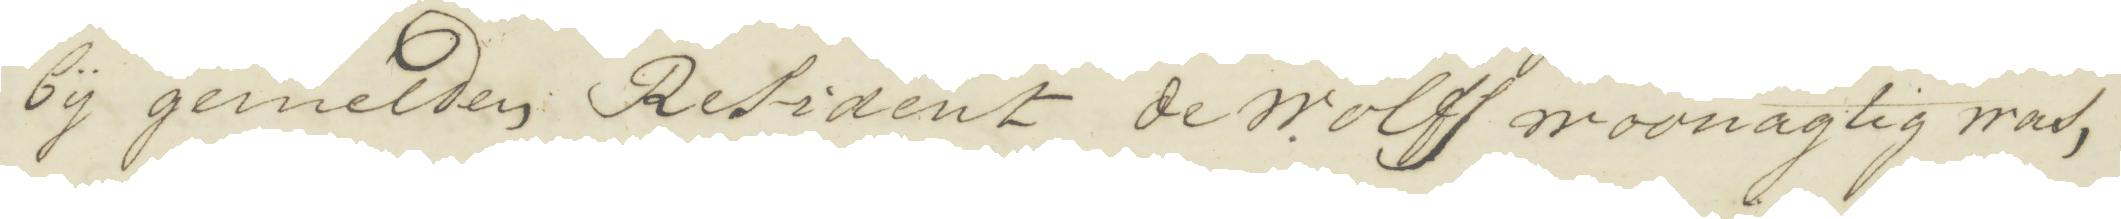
bij gemelden Resident de wolff woonagtig was,
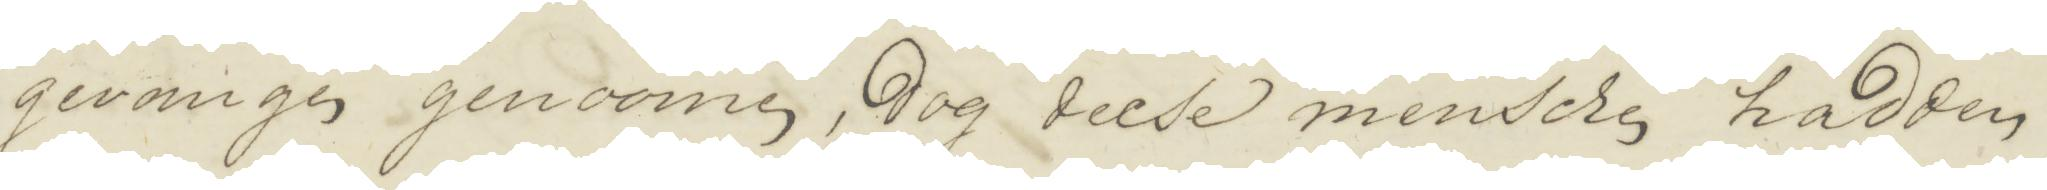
gevangen genoomen, dog deese menschen hadden
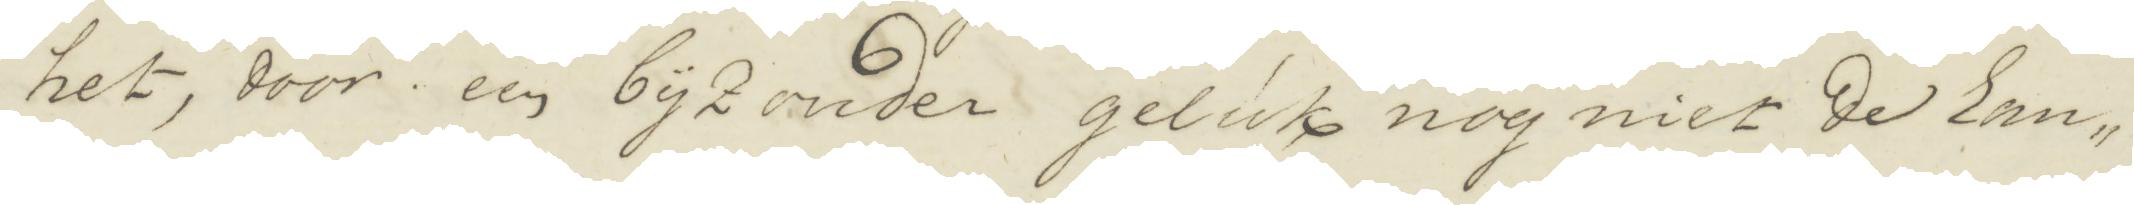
het, door een bijzonder geluk nog niet de han„
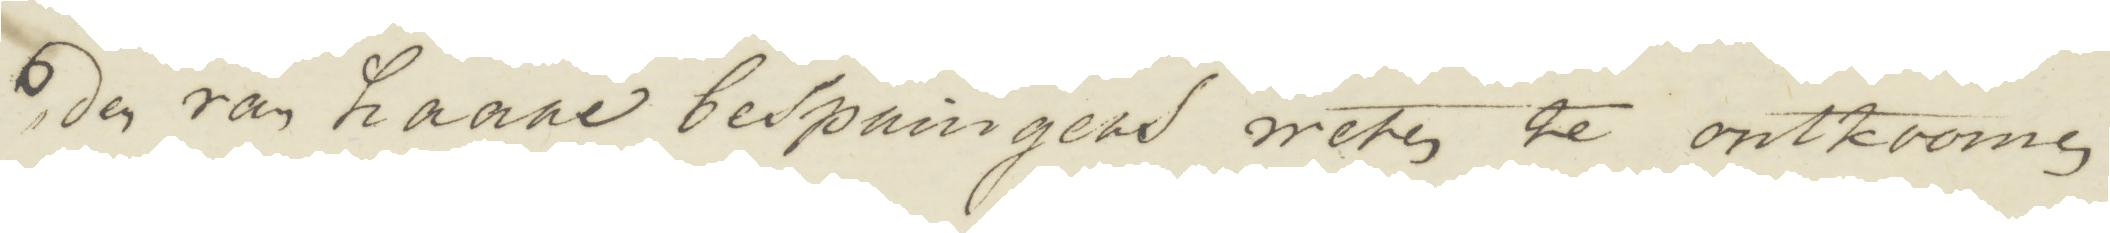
„den van haare bespringers weten te ontkoomen
